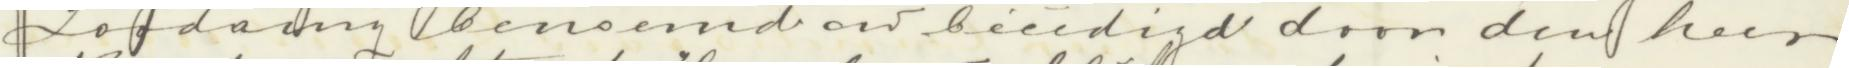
zoodanig benoemd en beëedigd door den heer
